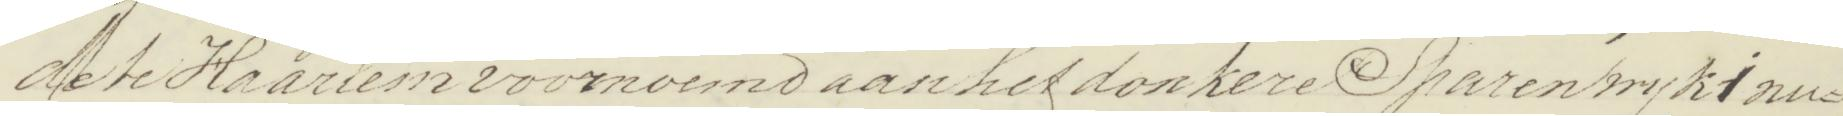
de te Haarlem voornoemd aan het donkere Sparen wyk 1 nu=
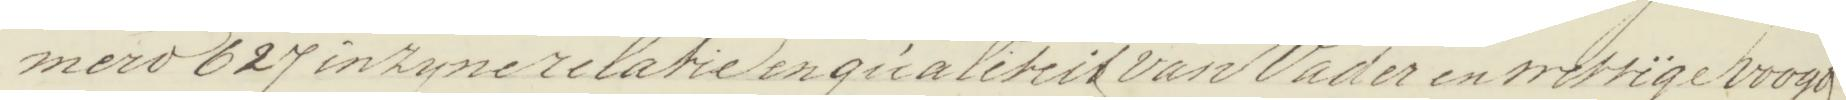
mero 627 inzyne relatie en qualiteit van Vader en wettige voogd
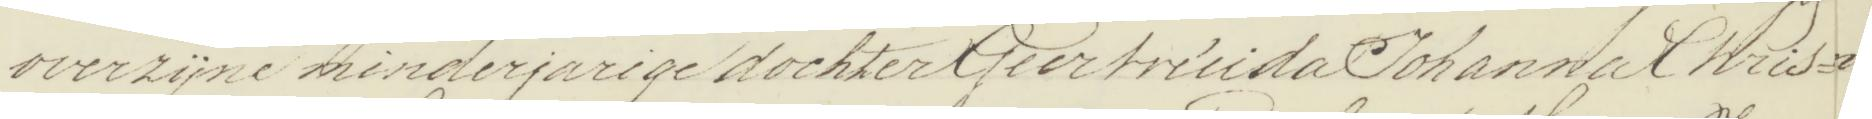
overzijne minderjarige dochter Geertruida Johanna Chris=
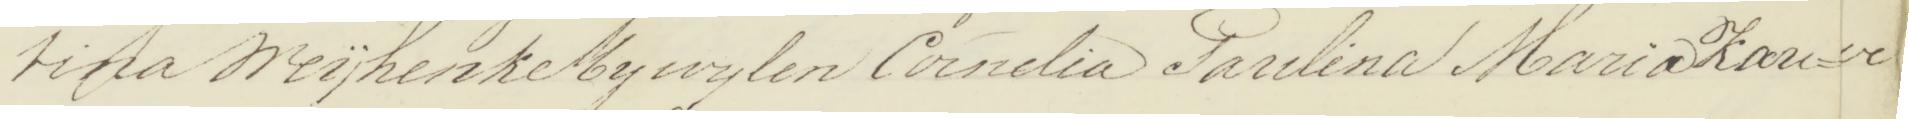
tina Weijhenke by wylen Cornelia Paulina Maria Kau=
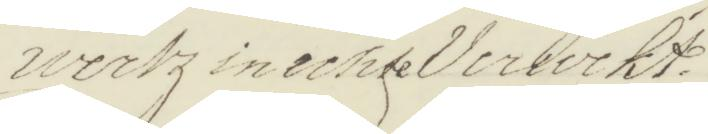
wertz in echte Verwekt.
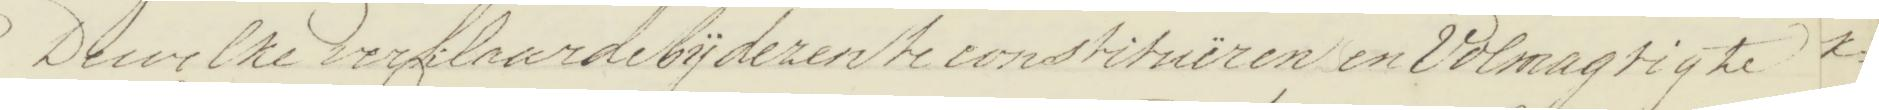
Dewelke verklaarde bij dezen te constituëren en Volmagtig te
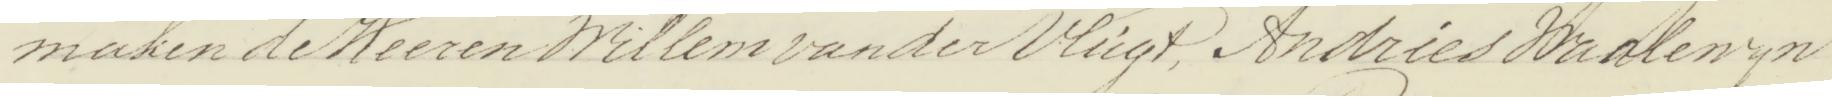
maken de Heeren Willem van der Vlugt, Andries Waalewyn
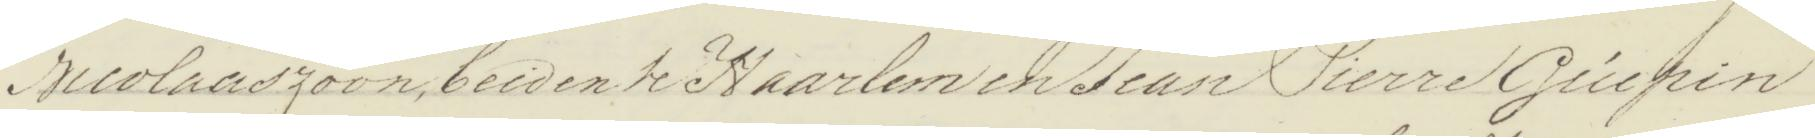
Nicolaaszoon, beiden te Haarlem en Iean Pierre Guepin
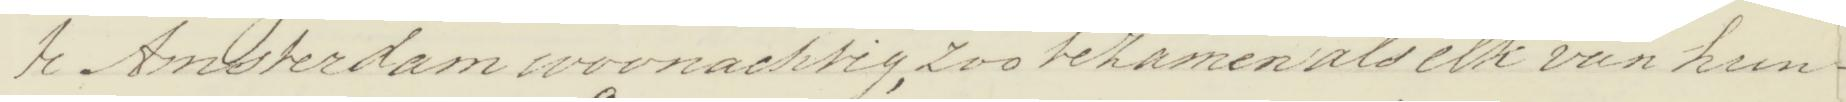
te Amsterdam woonachtig, zoo tezamen als elk van hun
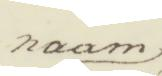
naam
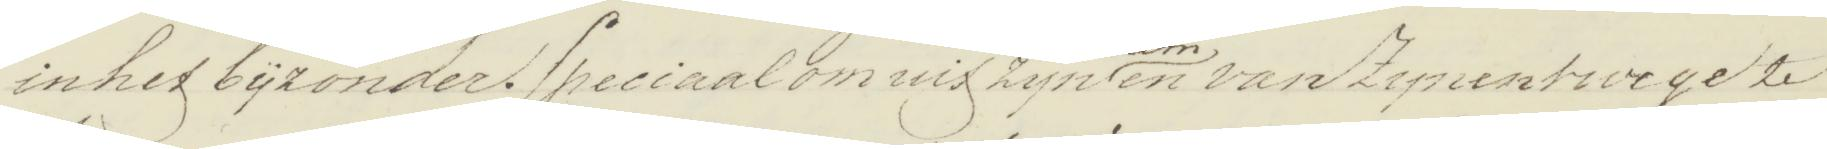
in het bijzonder. Speciaal om uit zyn en van Zynentwege te
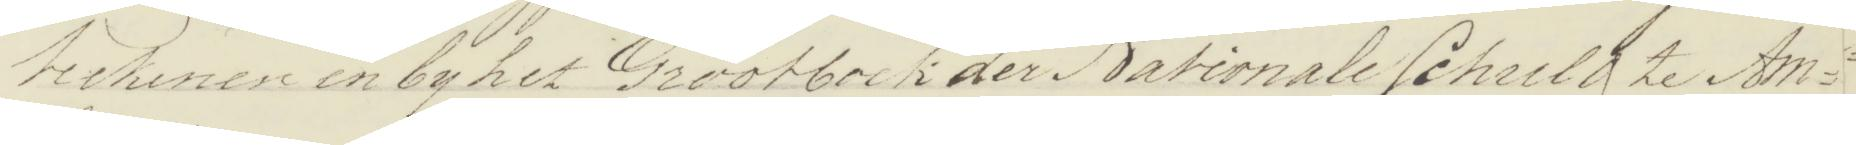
teekenen en by het Grootboek der Nationale Schuld te Am=
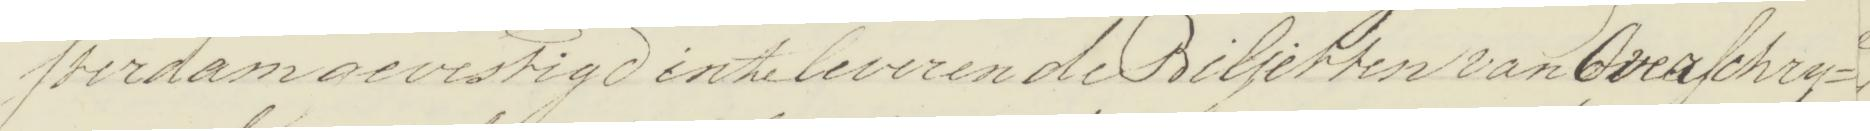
sterdam gevestigd inte leveren de Biljetten van Overschry=
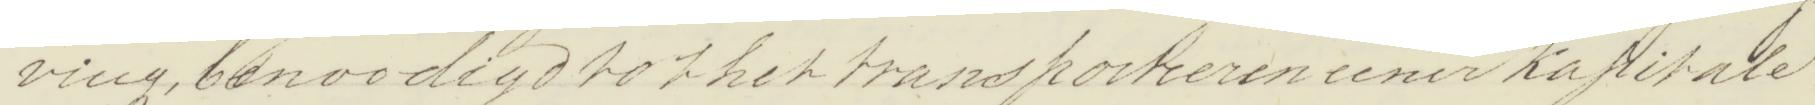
ving, benoodigd tot het transporteeren eener Kapitale
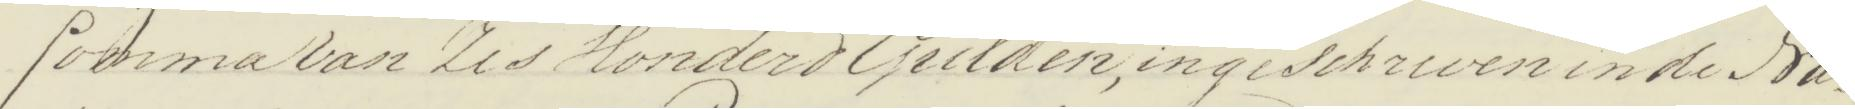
Somma van Zes Honderd Gulden, ingeschreven in de Na=
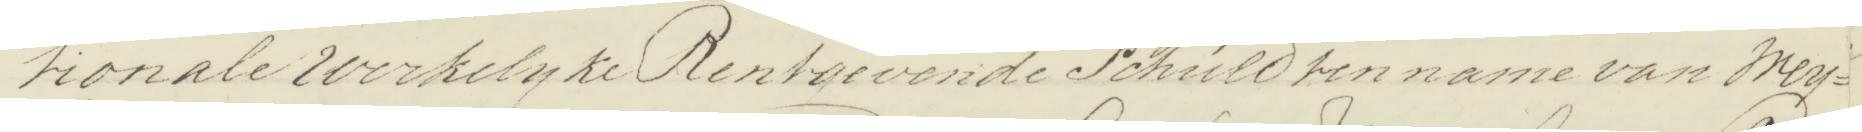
rionale werkelyke Rentgevende Schuld ten name van Wey=
